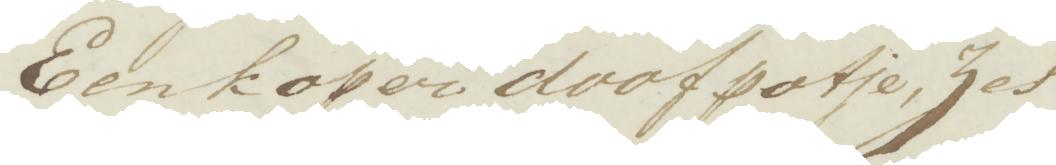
Een koper doofpotje, Zes
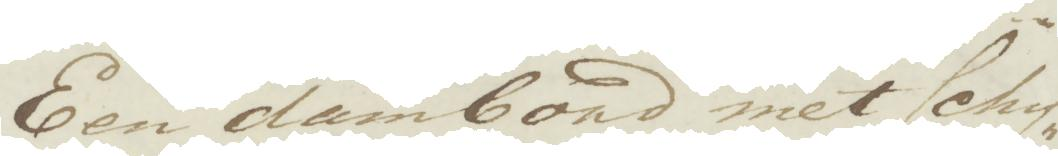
Een dambord met schij„
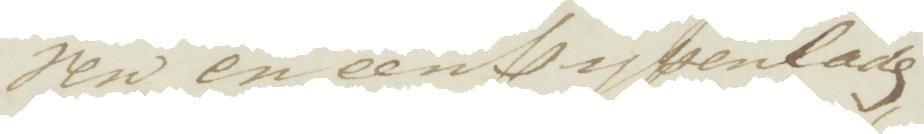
ven en een pijpenlade
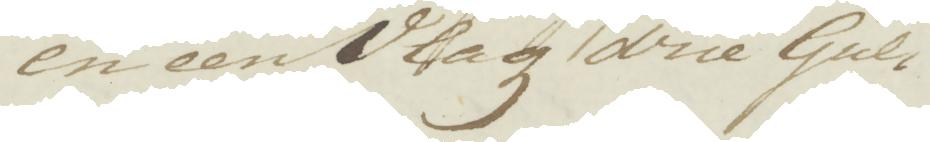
en een Vlag drie Gul=
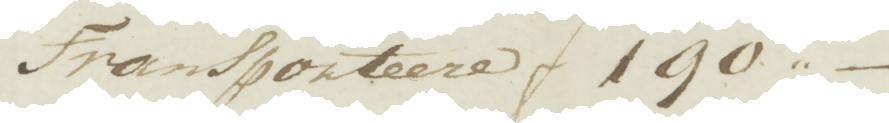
Transporteere ƒ 190 „-
